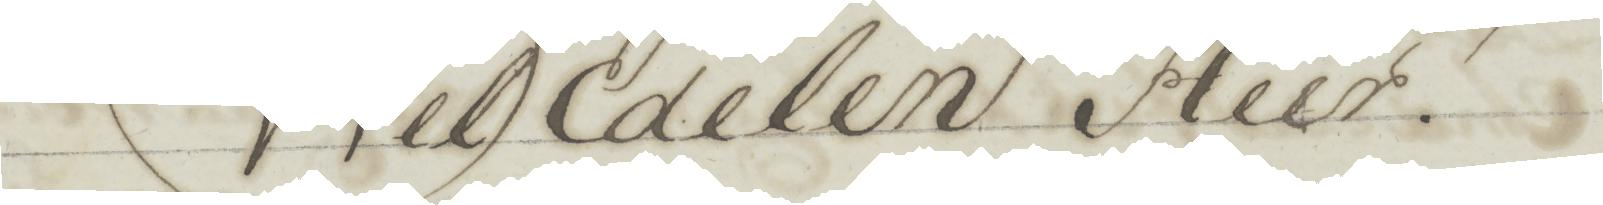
Wel Edelen Heer!
